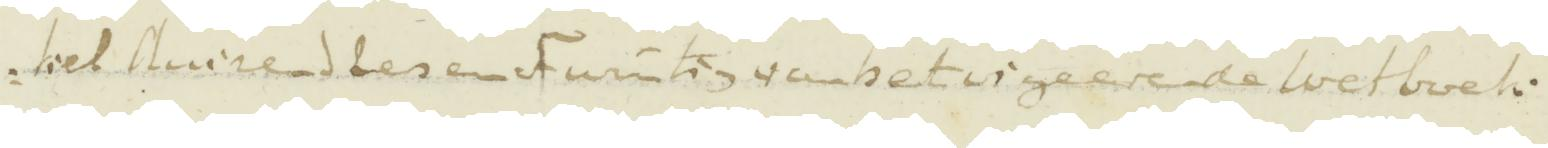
=kel duizend zes en Twintig van het vigeerende wetboek
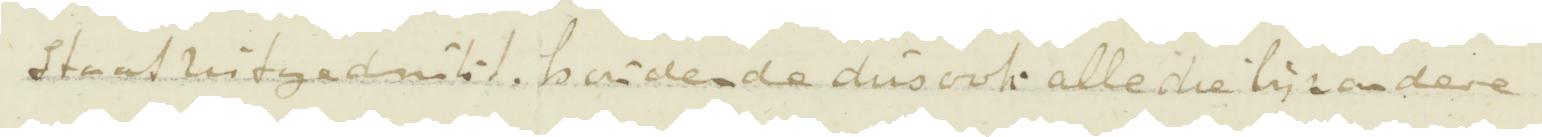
staat uitgedrukt. houdende dus ook alle die bijzondere
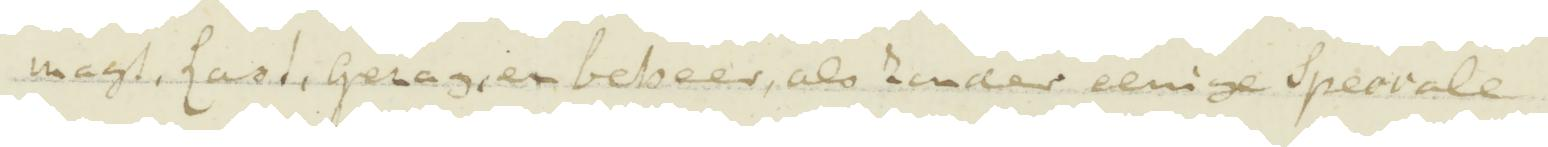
magt, last, gezag, en beheer, als zonder eenige speciale
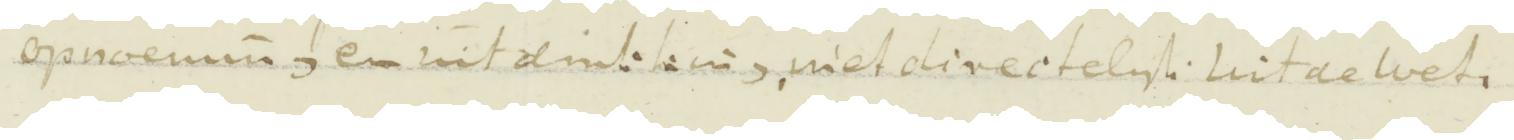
opnoeming, en uitdrukking, niet directelijk uit de wet,
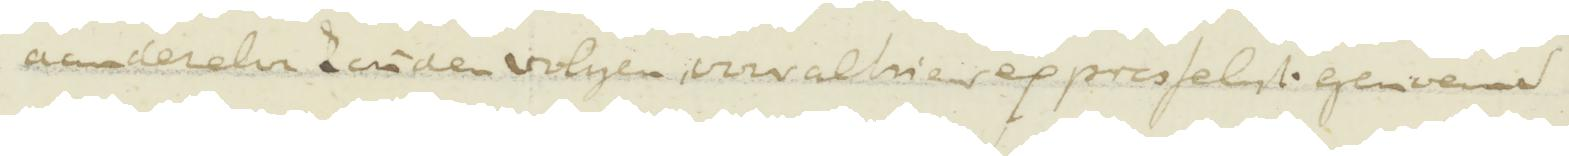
aan dezelve Zouden volgen, voor alhier expresselijk genoemd
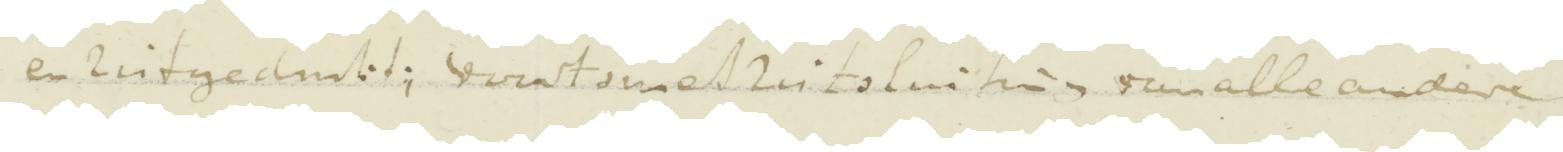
en uitgedrukt; voorts met uitsluiting van alle andere
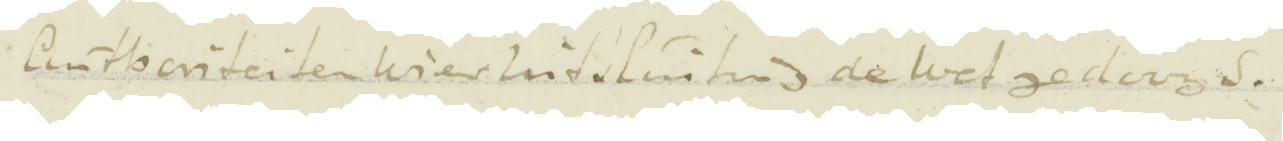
Authoriteiten hier uitsluitend de wet gedoogd.
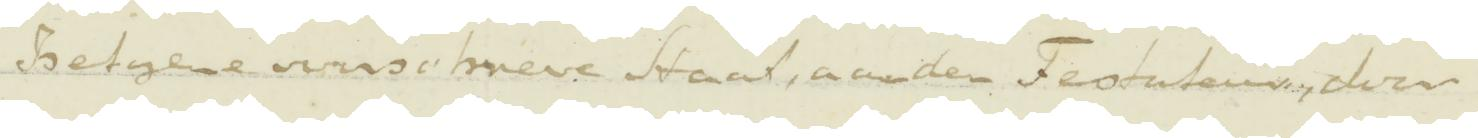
Hetgene voorschreve staat, aan den Testateur, door
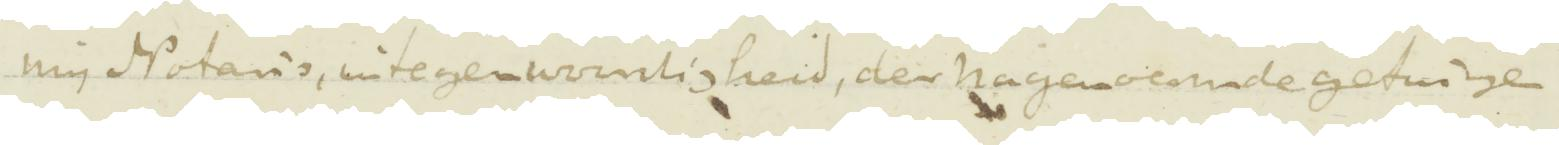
my Notaris, integenwoordigheid, der nagenoemde getuigen
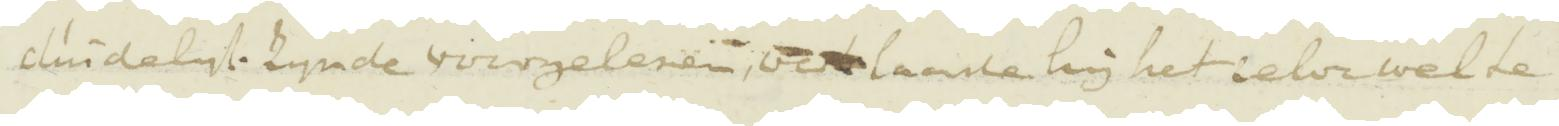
duidelijk Zynde voorgelezen, verklaarde hij het zelve wel te
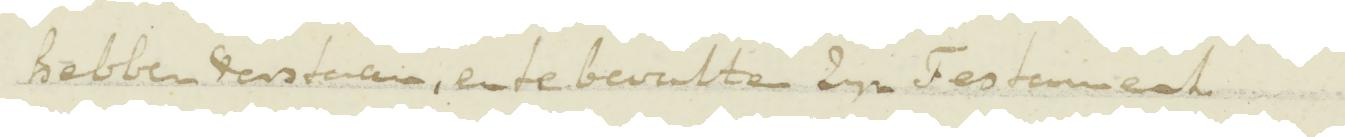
hebben verstaan, en te bevatten zyn Testament
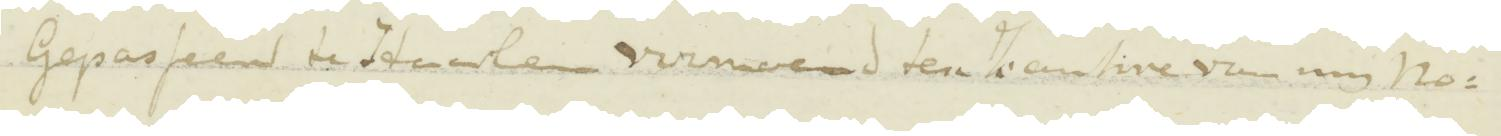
Gepasseerd te Haarlem voornoemd ten kantire van my No=
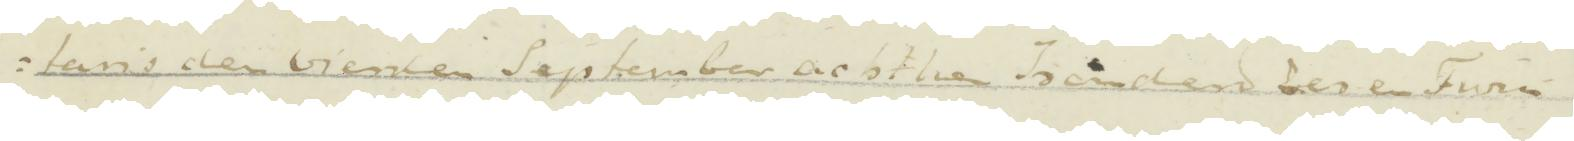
=taris den vierden september achttien honderd zes en Twin-
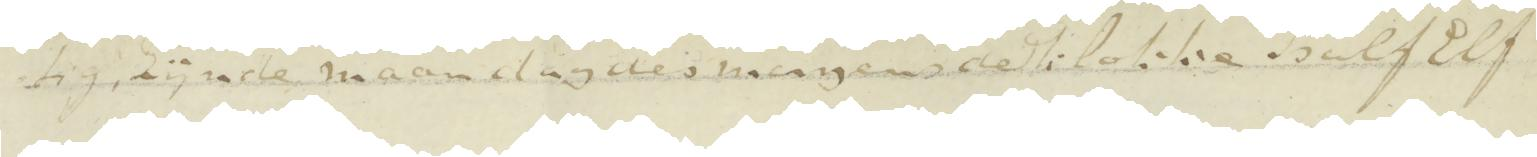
tig, Zijnde maandag des morgens de klokke half Elf
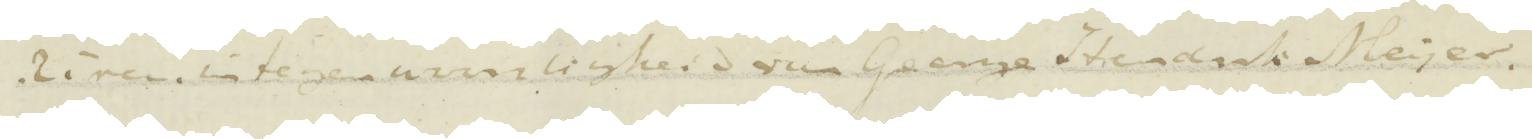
.Uren, integenwoordigheid van George Hendrik Meijer.
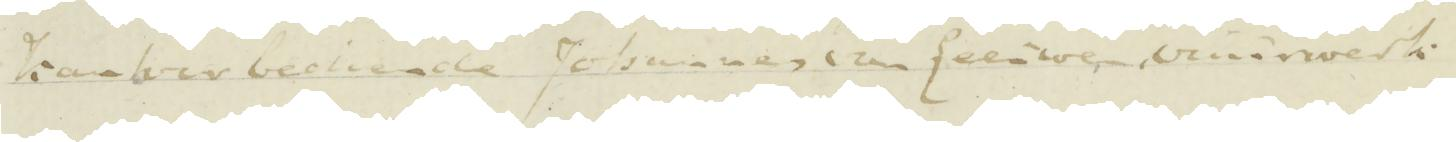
kantoorbediende Johannes van Leeuwen, vuurwerk
